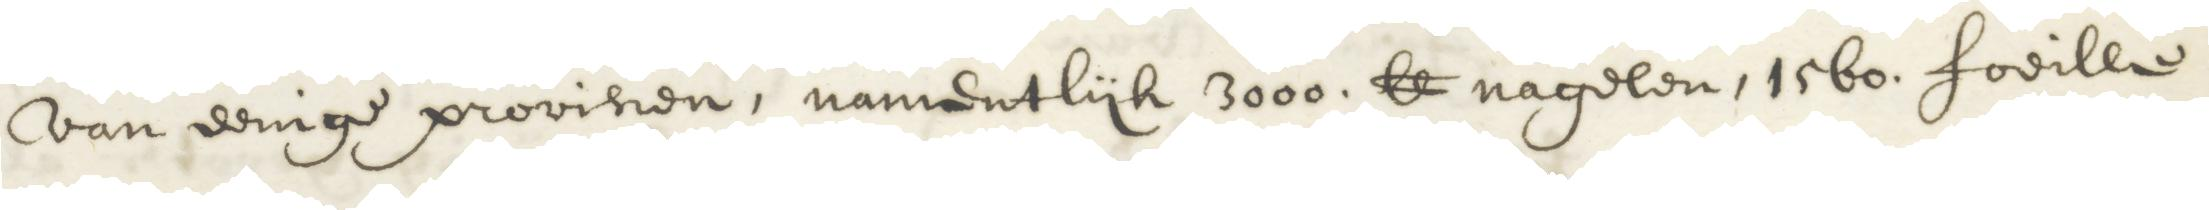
van eenige provisien, namentlijk 3000. lb nagelen, 1560. foeille,
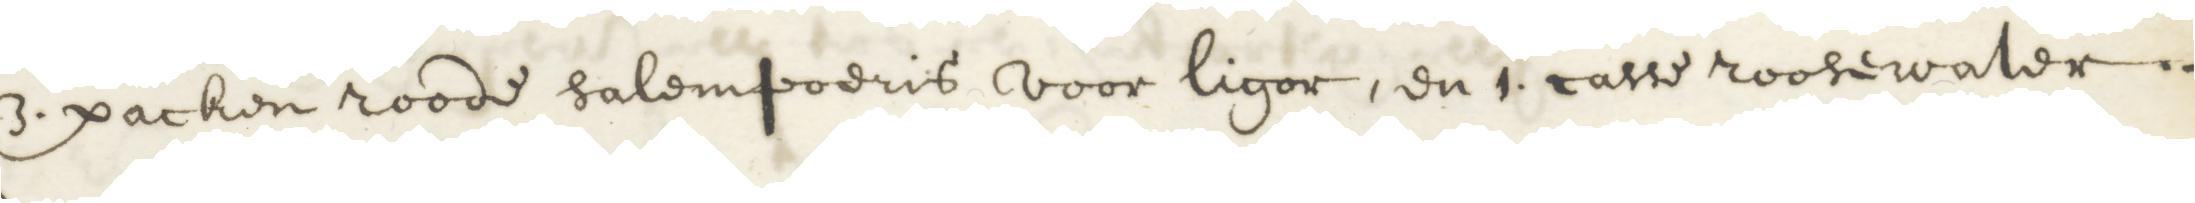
3. packen roode salempoeris voor ligor, en 1. casse roosewater.
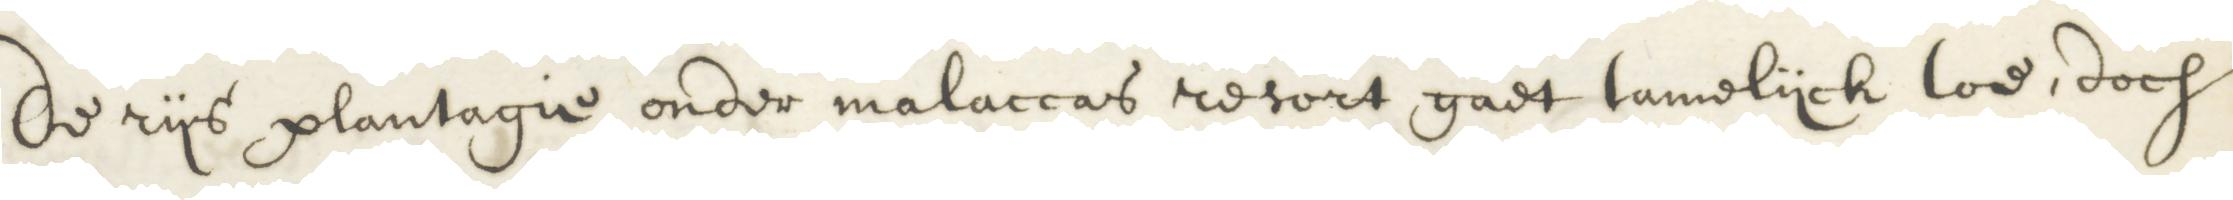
de rijs plantagie onder malaccas resort gaet tamelijck toe, doch
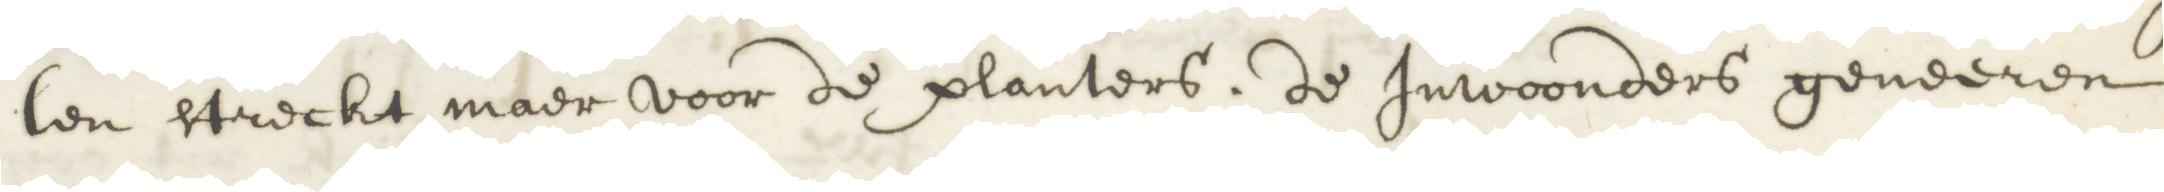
ten streckt maer voor de planters. de jnwoonders geneeren
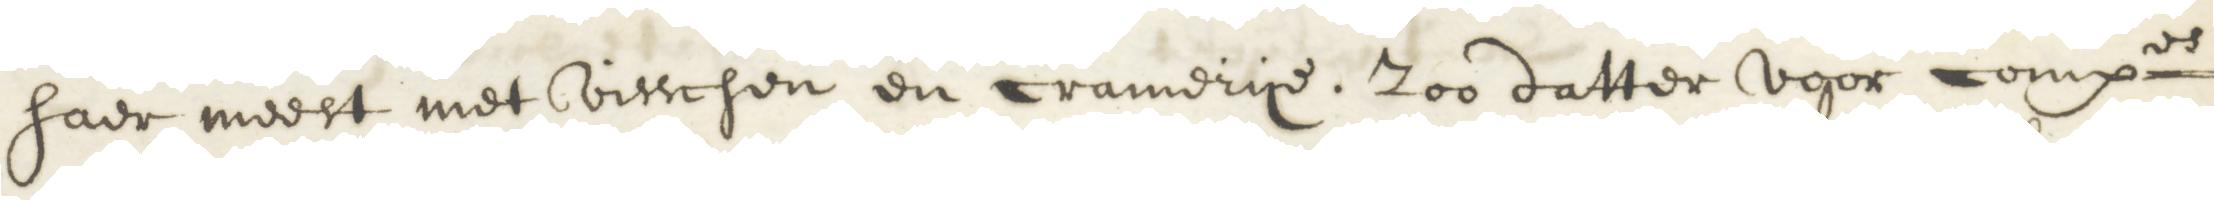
haer meest met visschen en cramerije, zoo datter voor comp=es
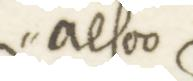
„alsoo
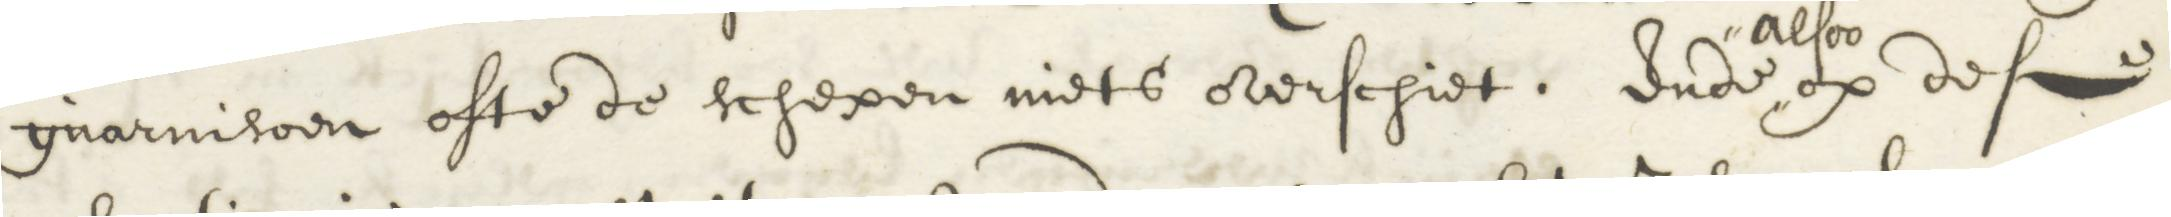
guarnisoen ofte de schepen niets overschiet. Ende „op dese
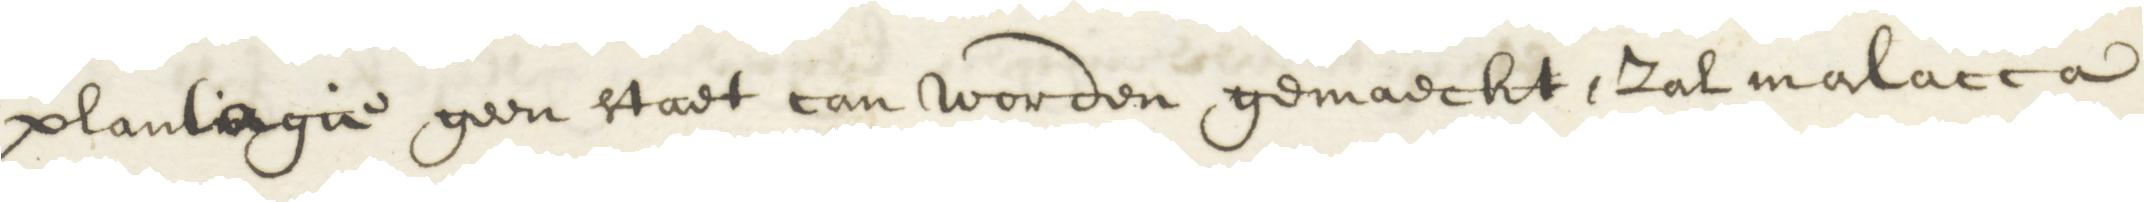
plantagie geen staet can worden gemaeckt, zal malacca
